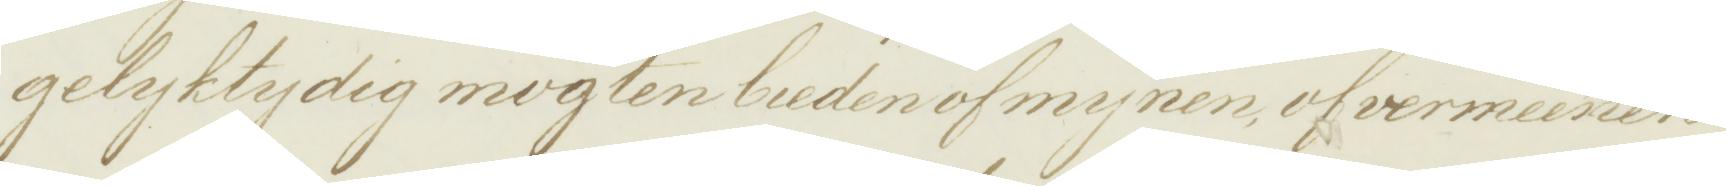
gelyktydig mogten bieden of mijnen, of vermeenen
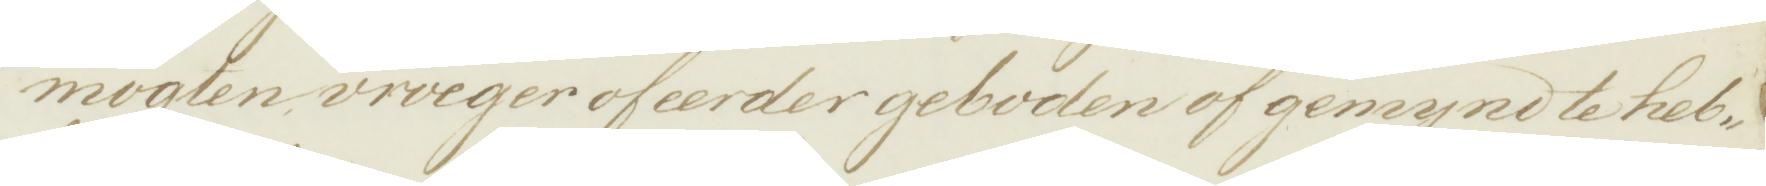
mogten vroeger of eerder geboden of gemynd te heb„
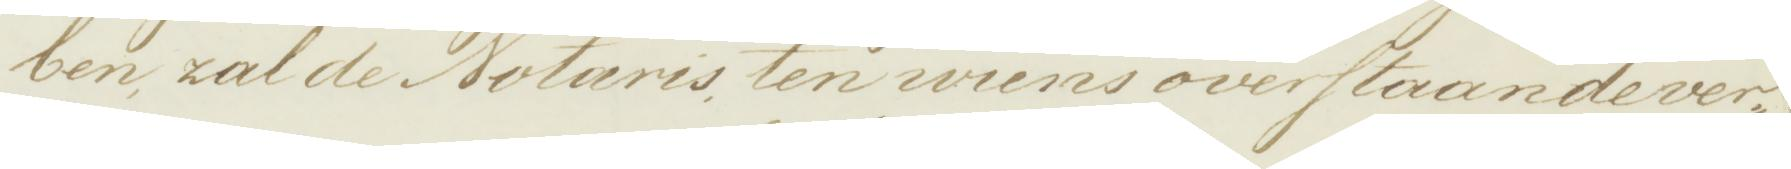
ben zal de Notaris, ten wiens overstaande ver„
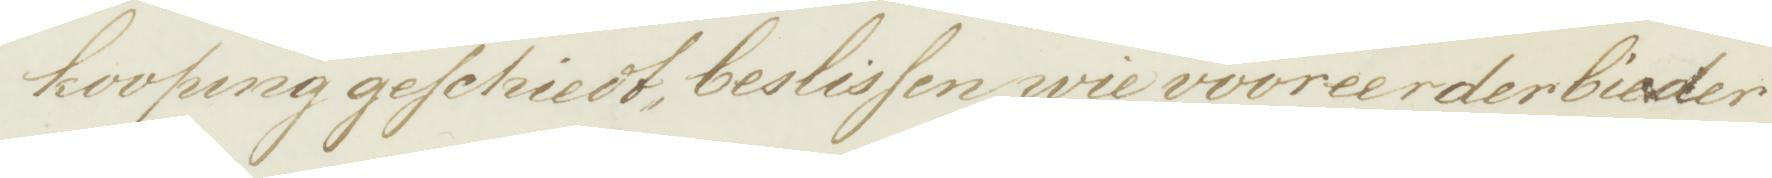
kooping geschiedt, beslissen wie voor eerder bieder
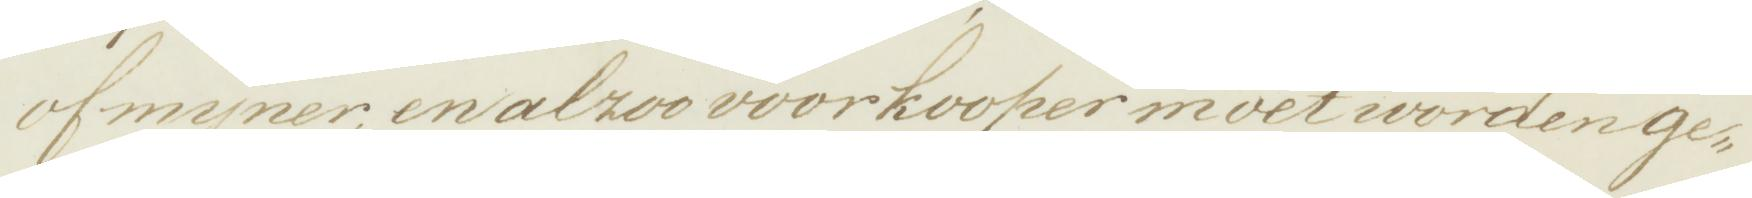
of myner, en alzoo voorkooper moet worden ge„
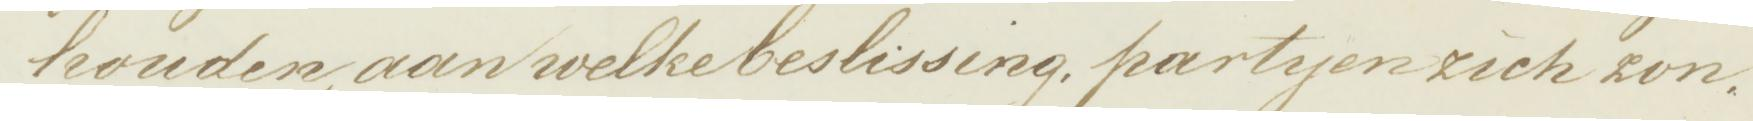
houden, aan welke beslissing, partyen zich zon„
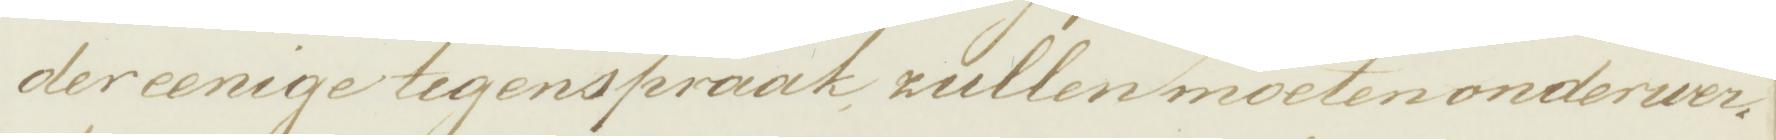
der eenige tegenspraak, zullen moeten onderwer„
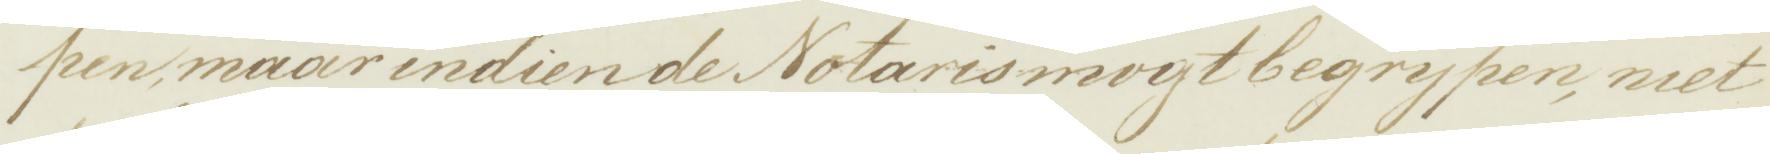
pen, maar indien de Notaris mogt begrypen, niet
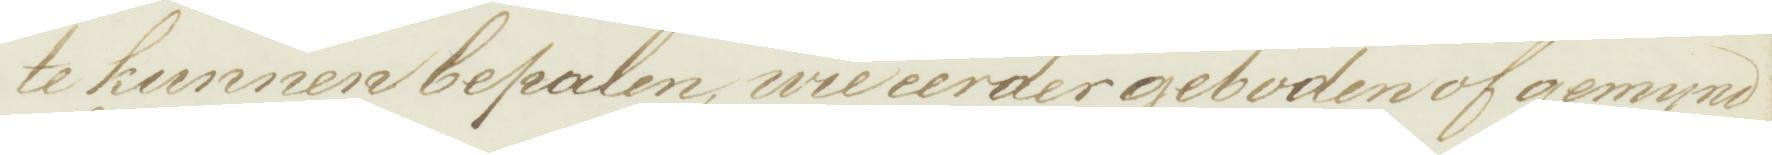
te kunnen bepalen, wie eerder geboden of gemynd
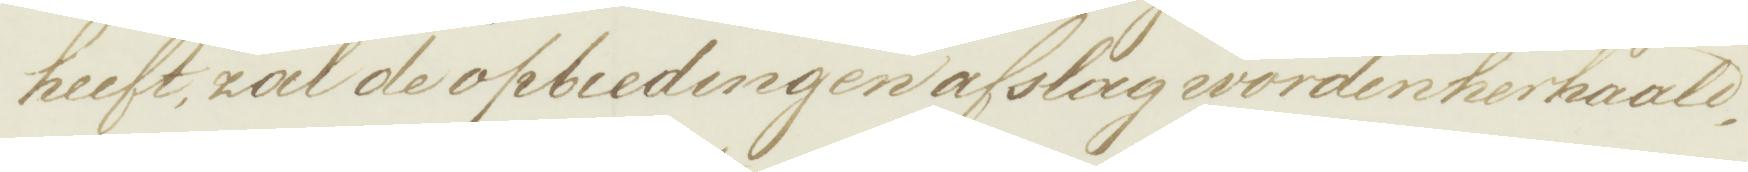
heeft, zal de opbiedingen afslag worden herhaald,
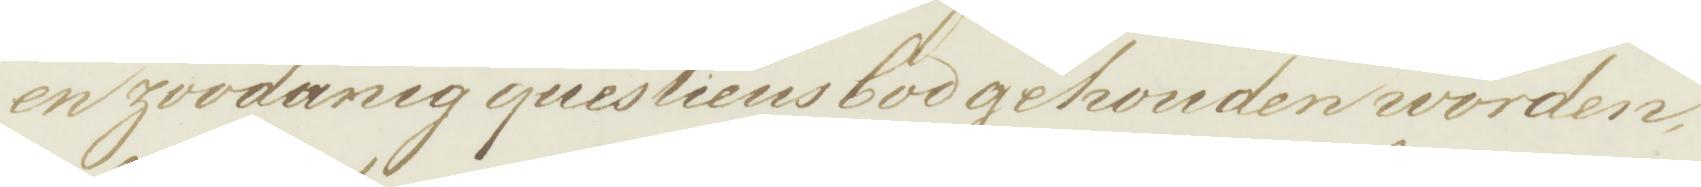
en zoodanig questieus bod gehouden worden,
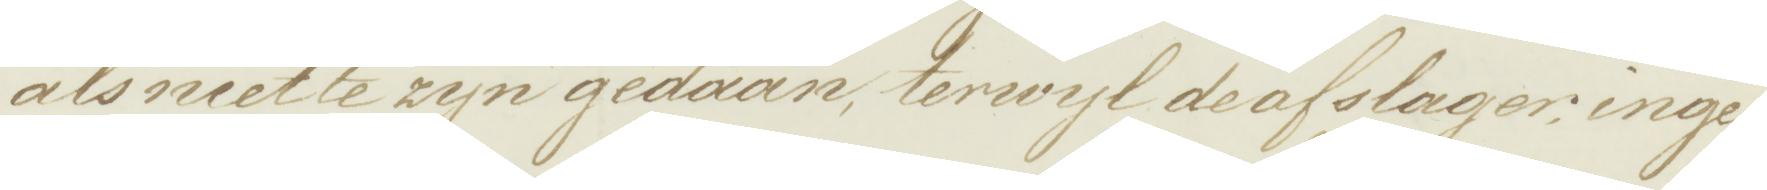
als niet te zyn gedaan, terwyl de afslager inge
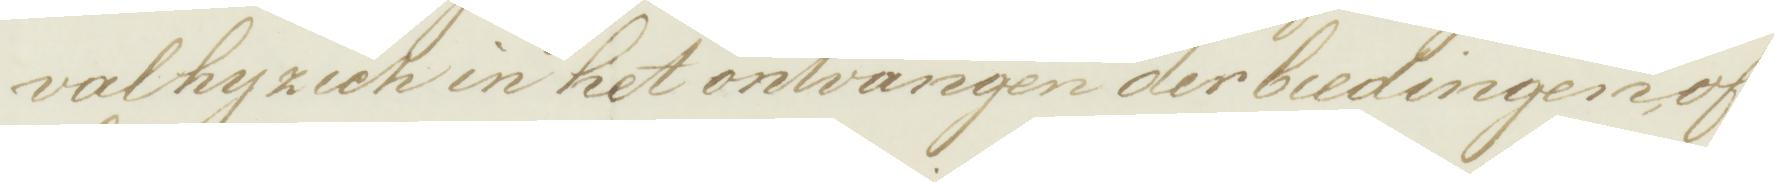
val hy zich in het ontvangen der biedingen, of
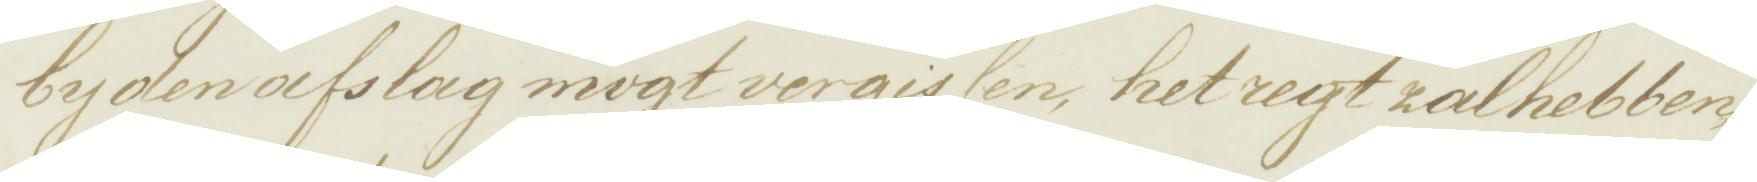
by den afslag mogt vergissen, het regt zal hebben,
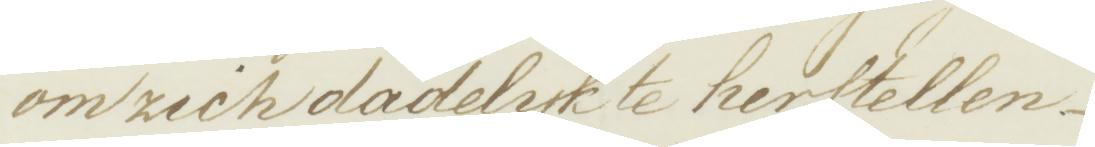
om zich dadelyk te herstellen.-
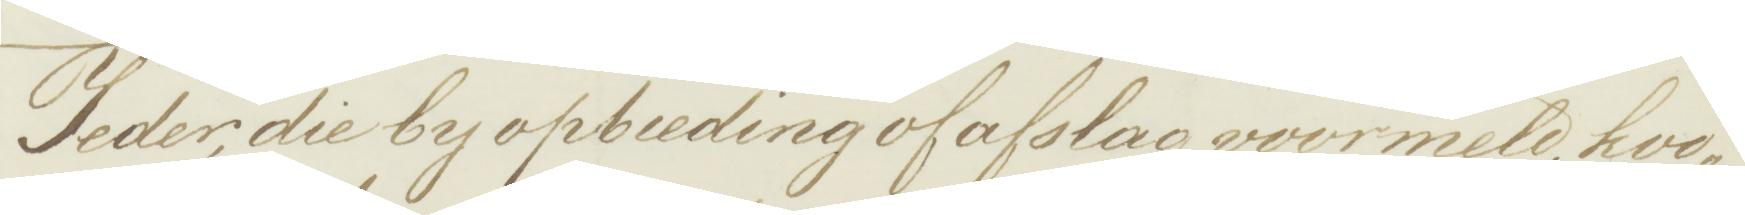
Ieder, die by opbieding of afslag voormeld, koo„
